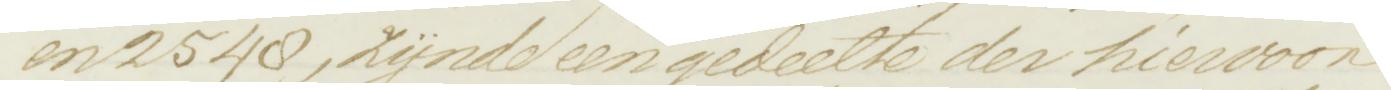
en 2548, zijnde een gedeelte der hiervoor
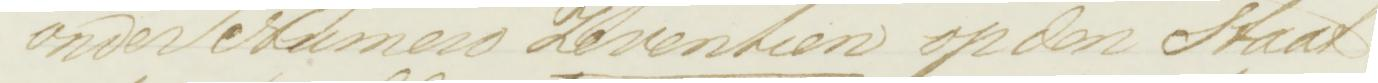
onder Numero Zeventien op den staat
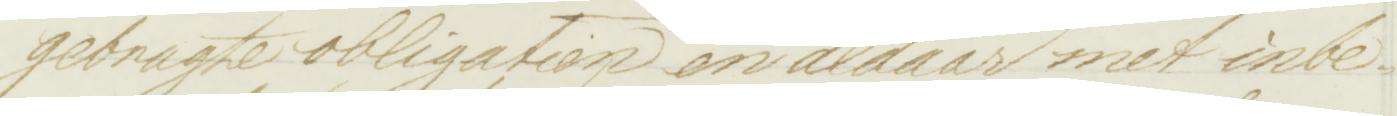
gebragte obligatien en aldaar met inbe,
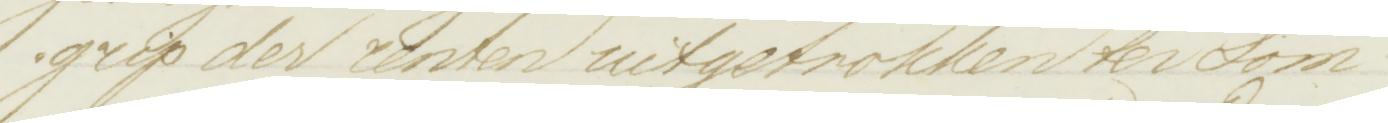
„grip der renten uitgetrokken ter som
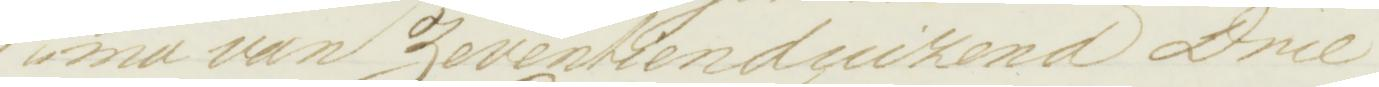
„ma van Zeventienduizend Drie
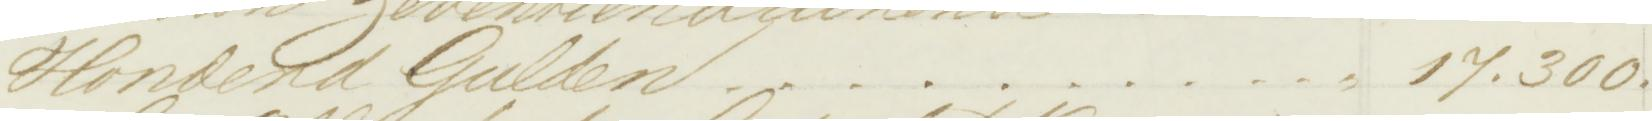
Honderd Gulden . . . . . . . . . . „ 17.300
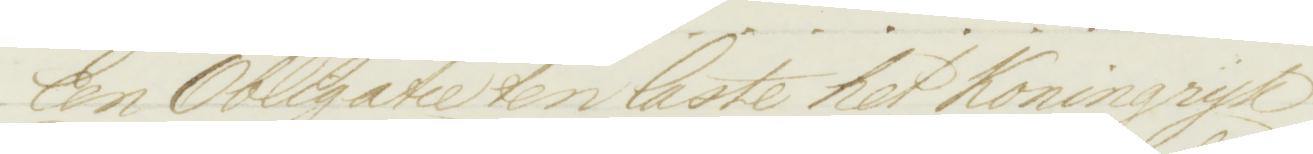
Een Obligatie ten laste het Koningrijk
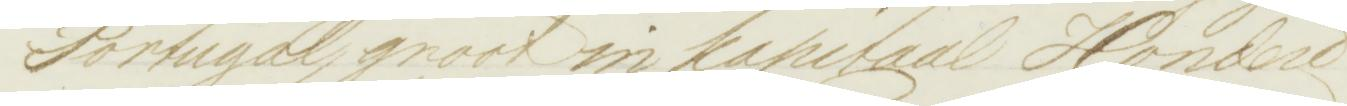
Portugal, groot in kapitaal Honderd
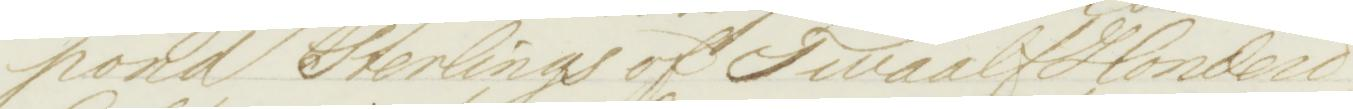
pond Sterlings of Twaalf Honderd
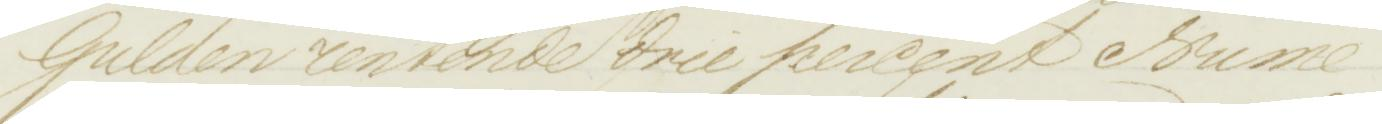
Gulden rentende drie percent Nume
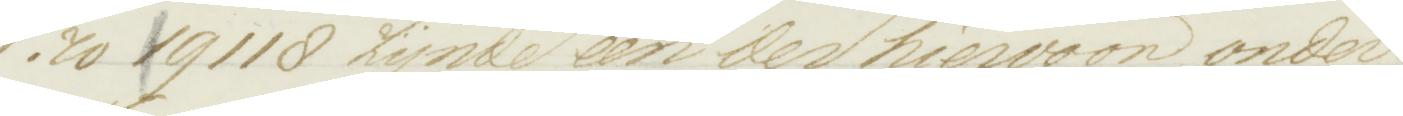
„ro 19118 zijnde een der hiervoor onder
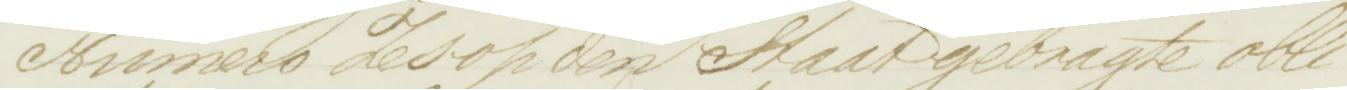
Numero Zes op den Staat gebragte obli
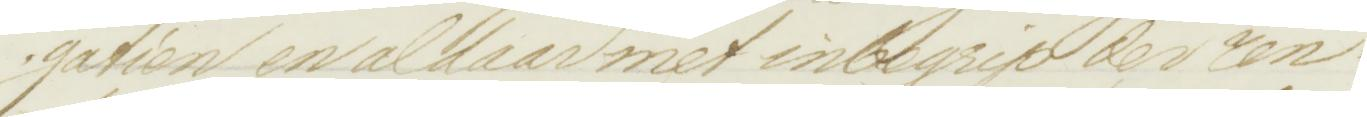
„gatien en aldaar met inbegrip der ren
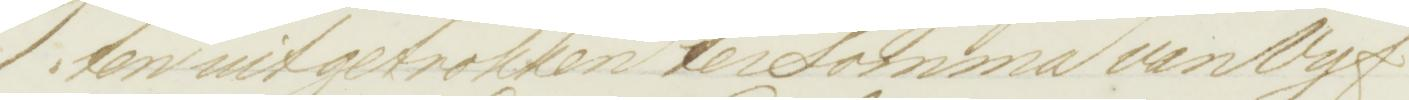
„ten uitgetrokken ter somma van Vijf
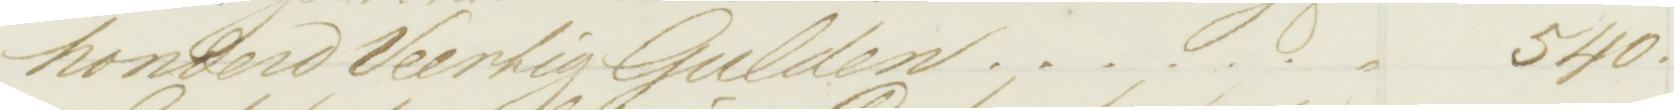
honderd Veertig Gulden . . . . . . „ 540.
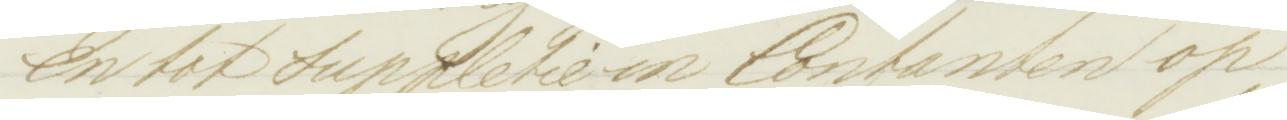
En tot suppletie in Contanten op
